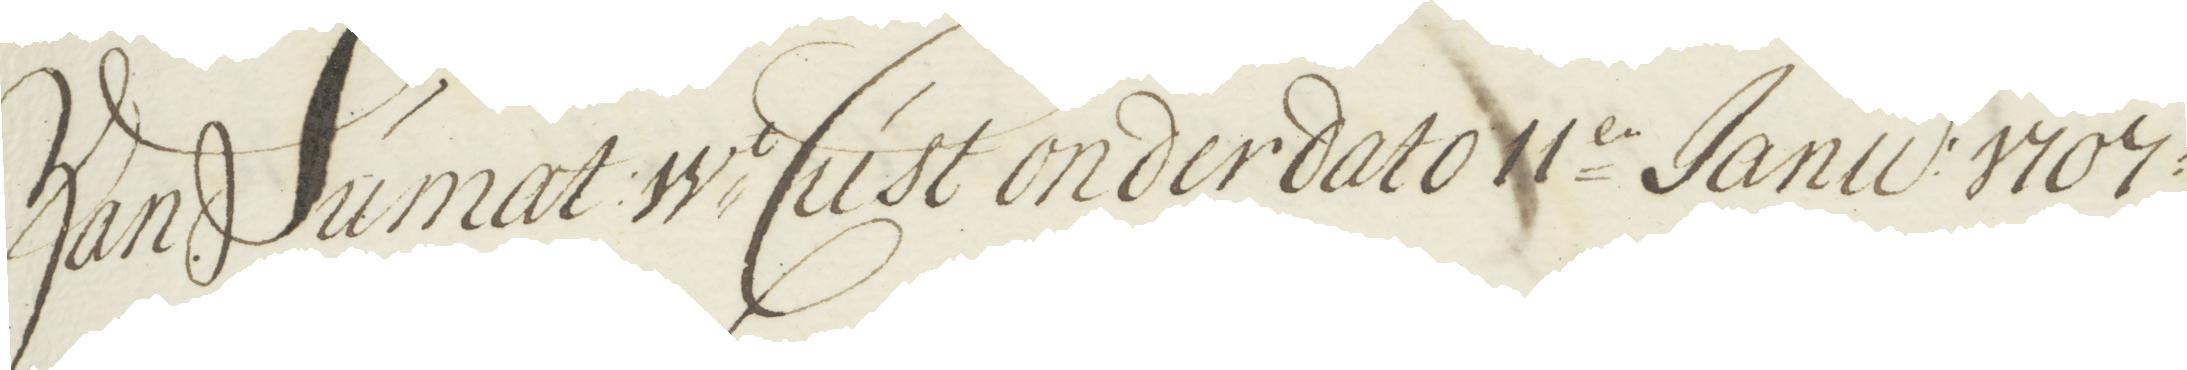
Van Sumat:s w„t Cust onder dato 11=en Janu: 1707:
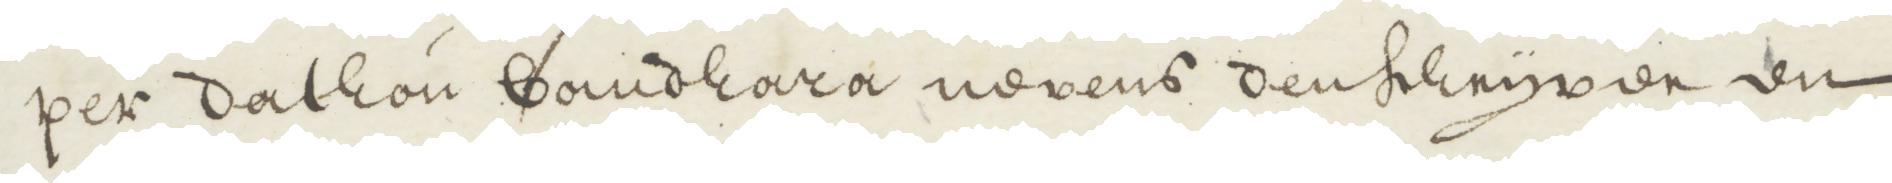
per dathou bandhara nevens den schrijver en
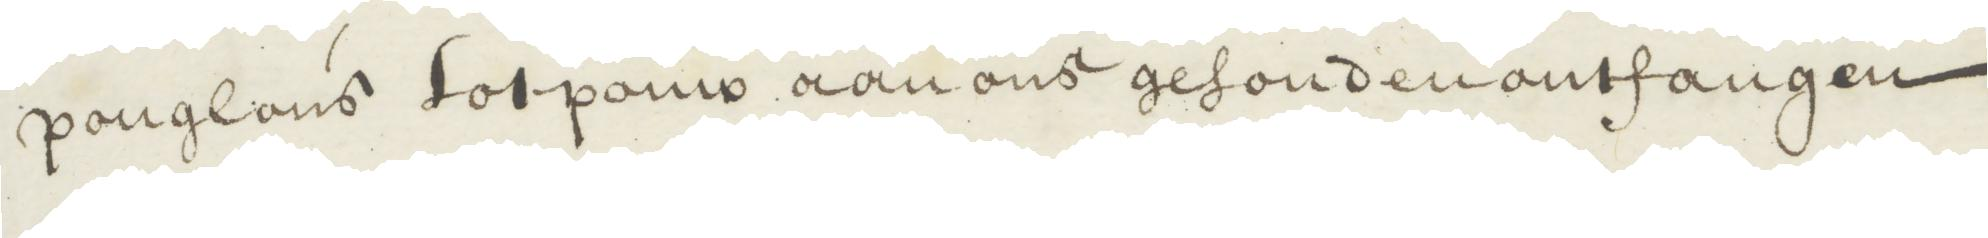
ponglous totpouw aan ons gesonden ontfangen
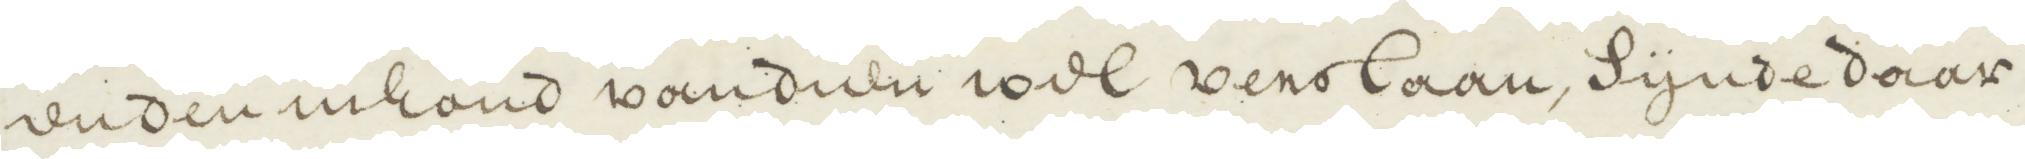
en den inhoud van dien wel verstaan, sijnde daar
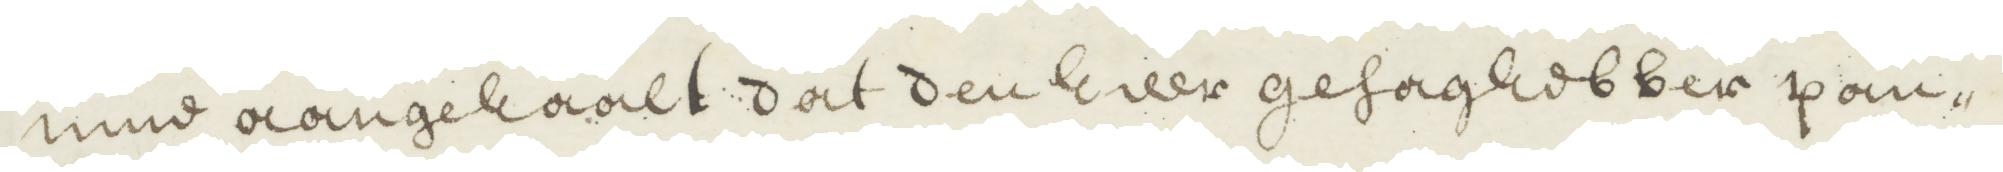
inne aangehaalt dat den heer gesaghebber pan„
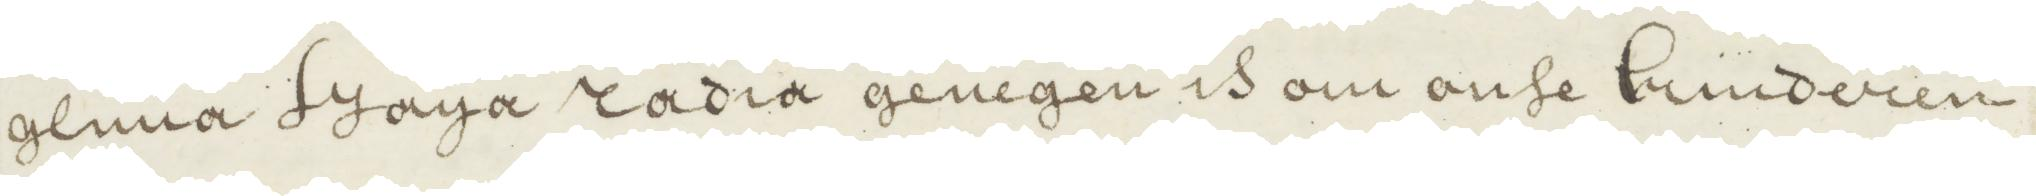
glima 'tjaija radia genegen is om onse kinderen
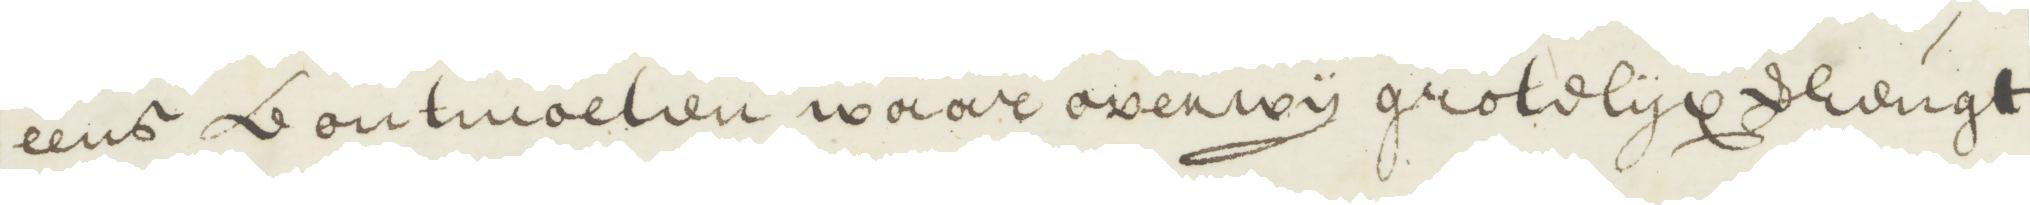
eens te ontmoelen waar overwij grotelijx verheugt
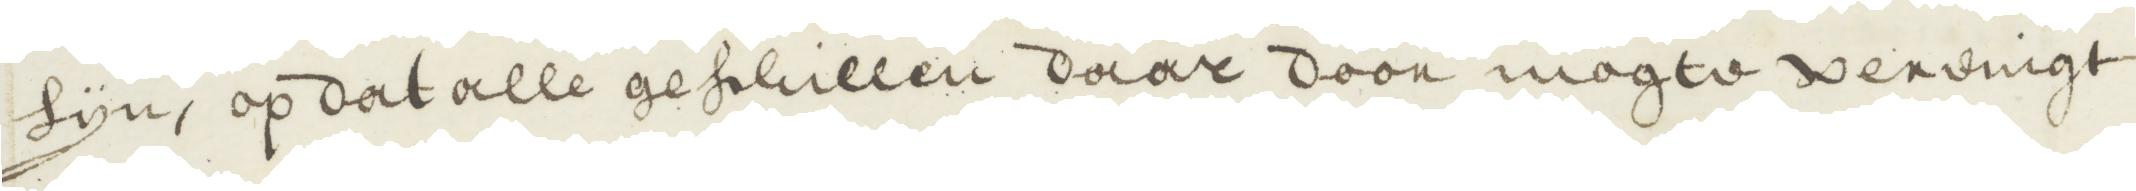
sijn, op dat alle geschillen daar door mogte verenigt
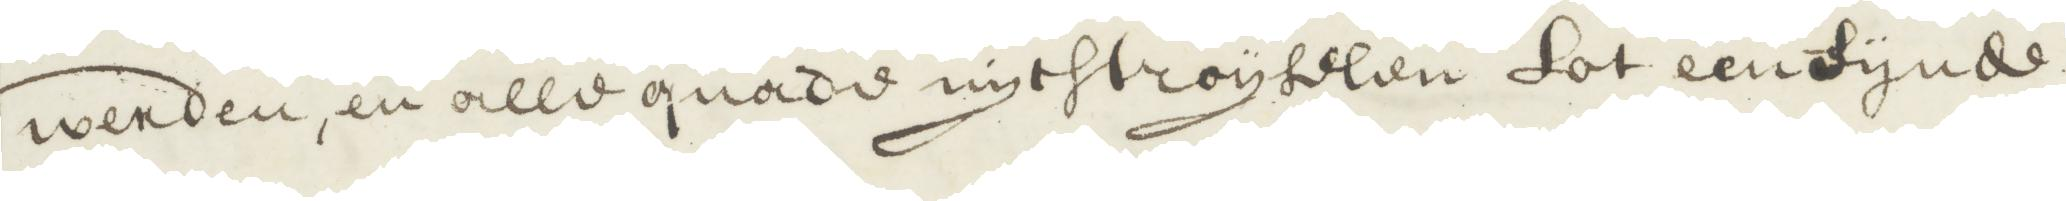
werden, en alle quade uijtstroijselen tot een sijnde
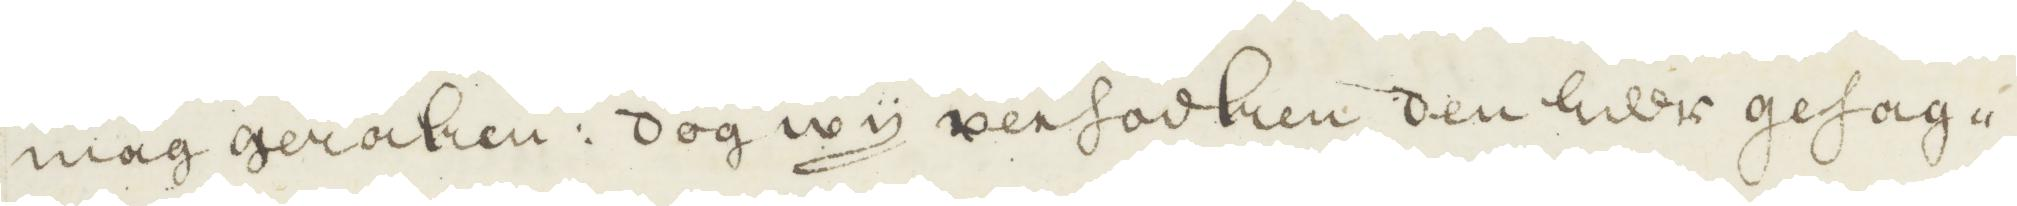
mag geraken: dog wij versoeken den heer gesag„
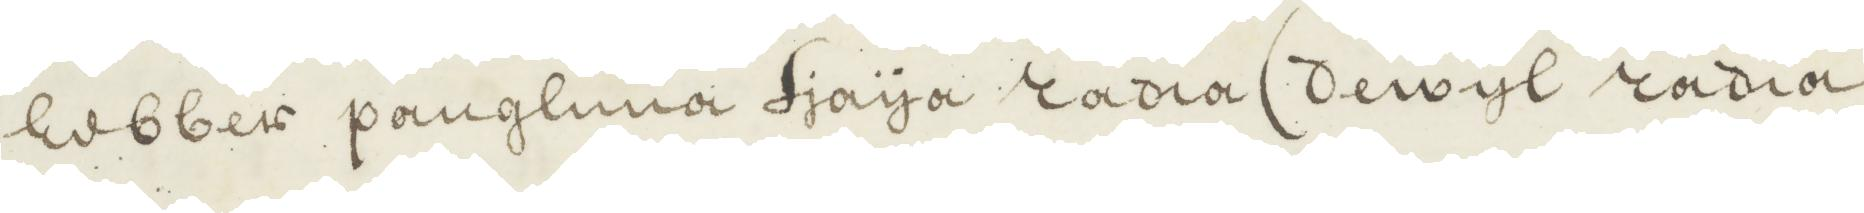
hebber panglima tjaija radia (dewijl radia
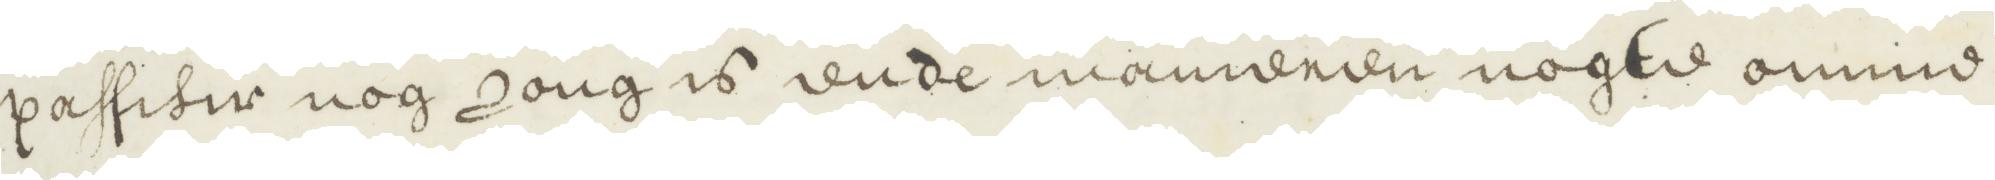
passisir nog jong is ende manieren nogte omme
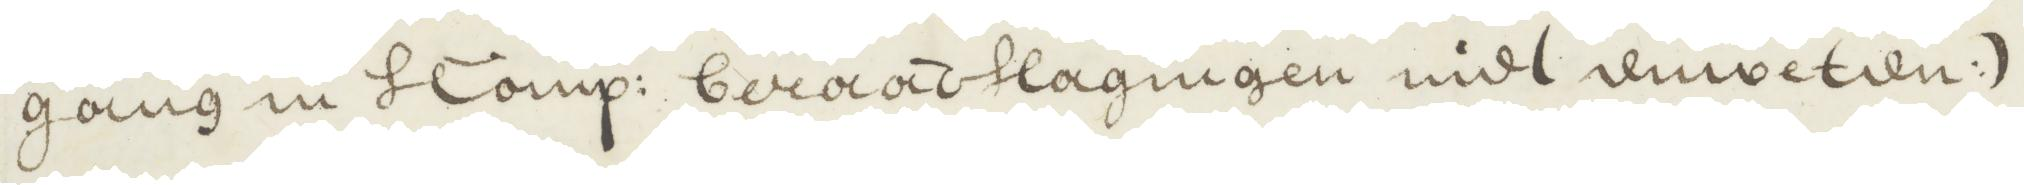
gang in ’s Comp:s beraadslagingen niet enweten:)
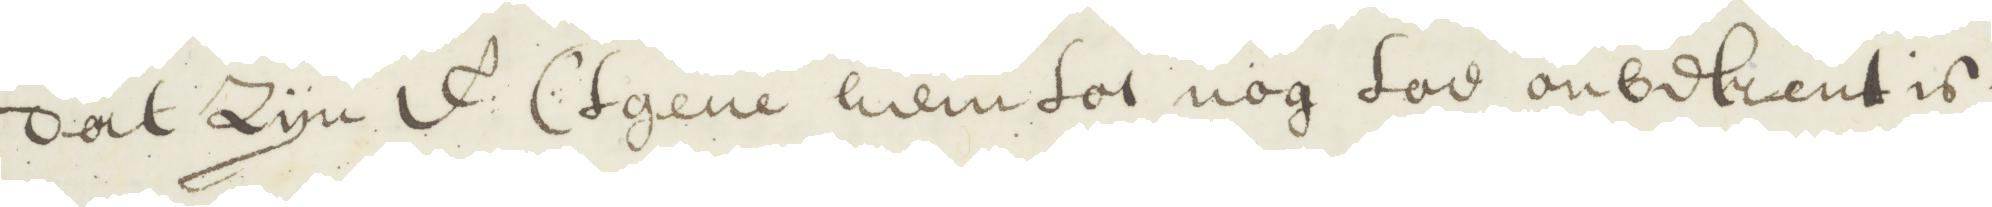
dat zijn E: (tgene hem tot nog toe onbekent is:)
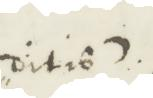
„ditis
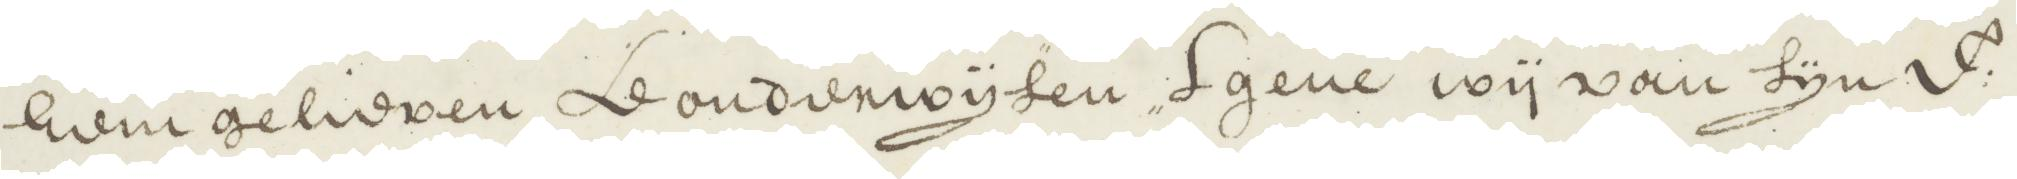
hem gelieven te onderwijsen „tgene wij van sijn E:
